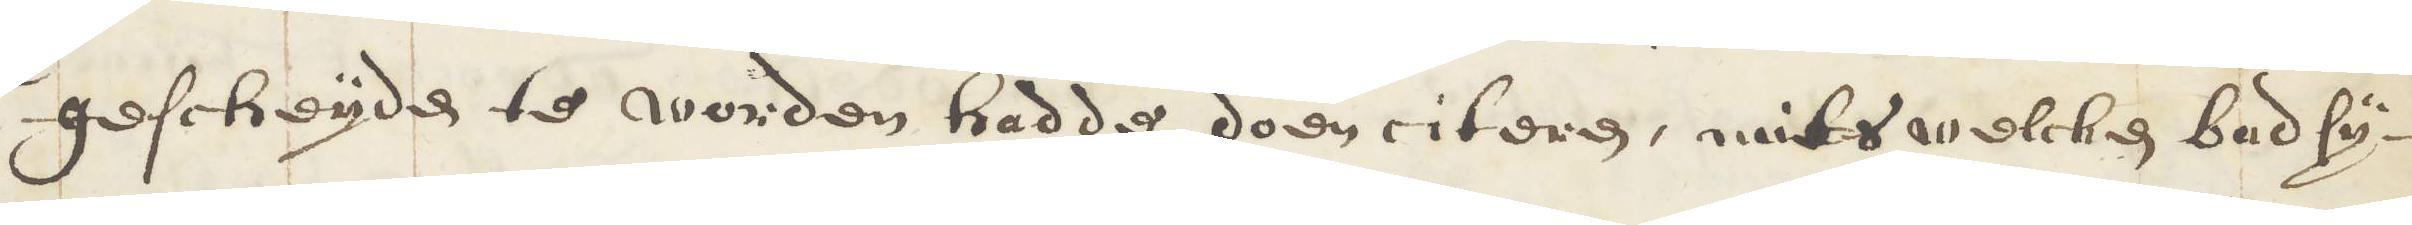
gescheijden te worden hadde doen citeren, mits welcken bad sij-
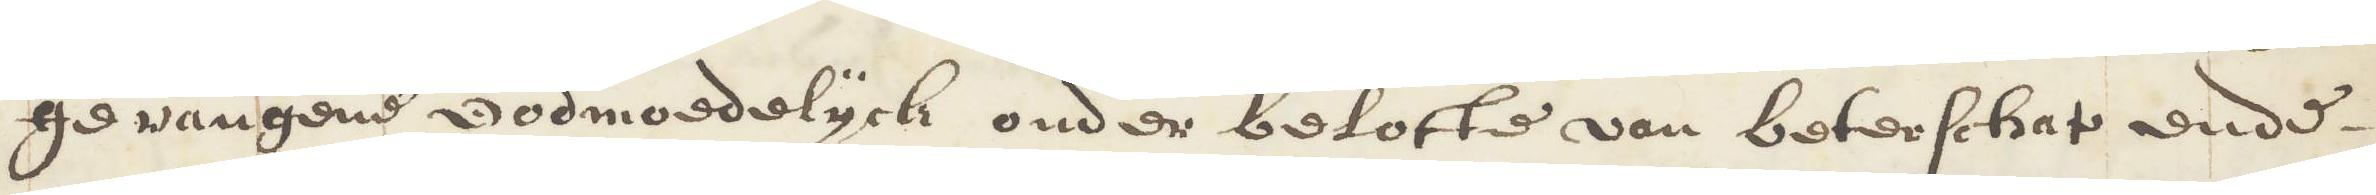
gevangene oodmoedelijck onder belofte van beterschap ende
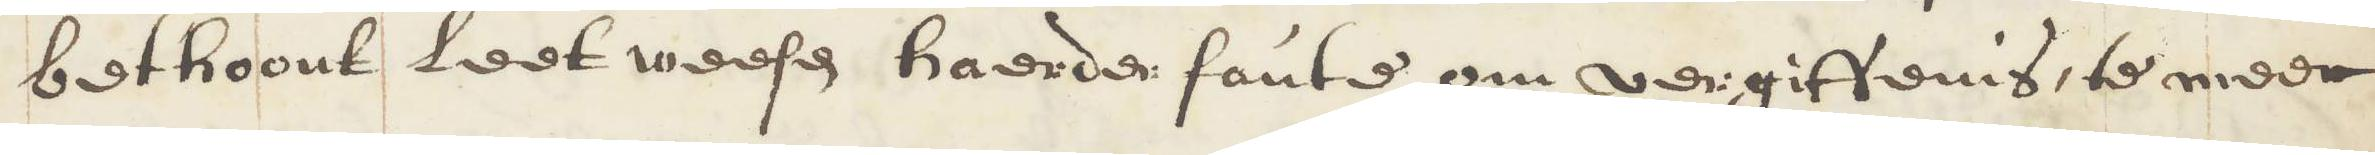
bethoont leet weesen haerden faute om vergiffenis, te meer
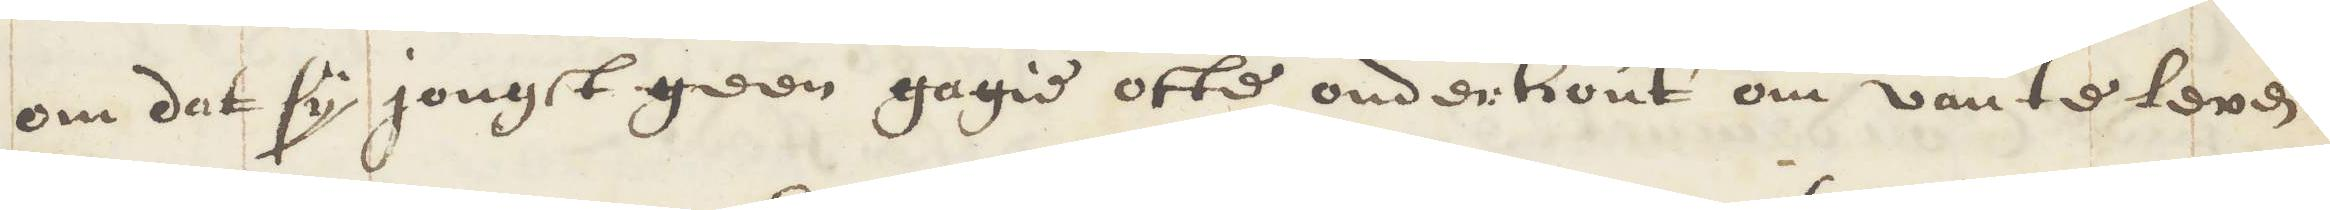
om dat sij jongst geen gagie offe onderhout om van te leven
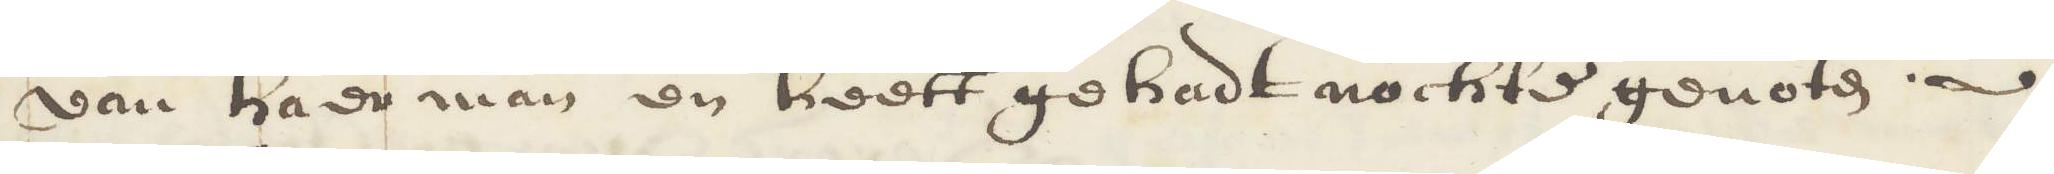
van haer man en heeft gehadt nochte genoten —
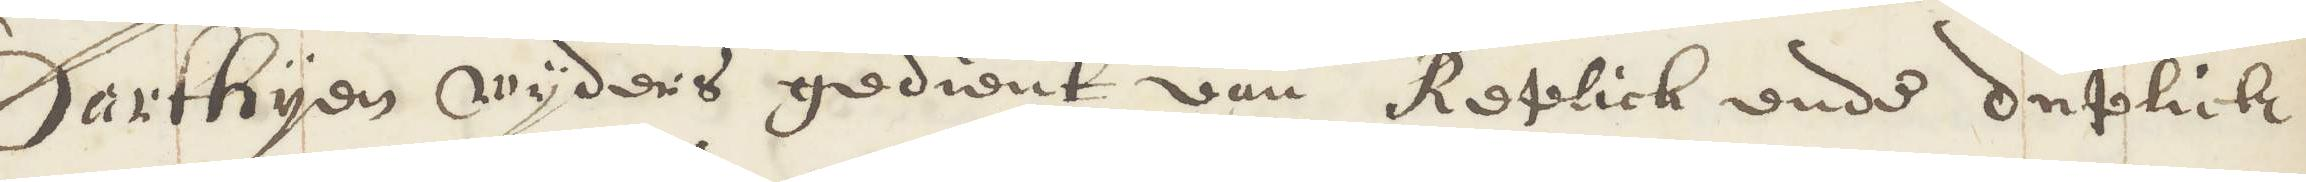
Parthijen wijders gedient van Replick ende duplick
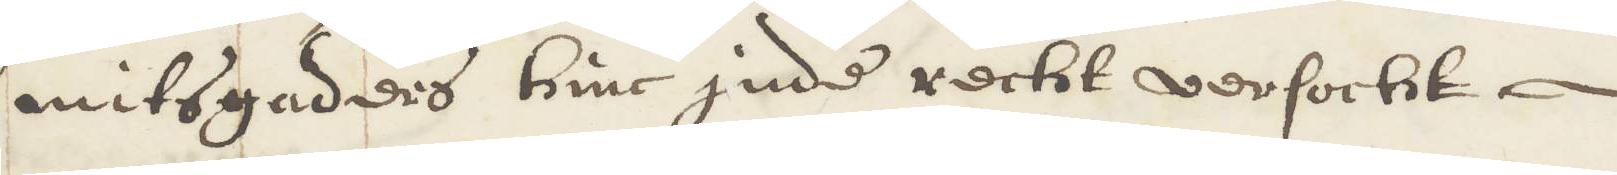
mitsgaders hinc jude recht versocht —
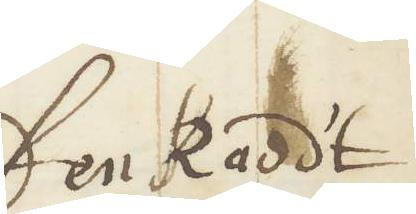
Den Raed't
